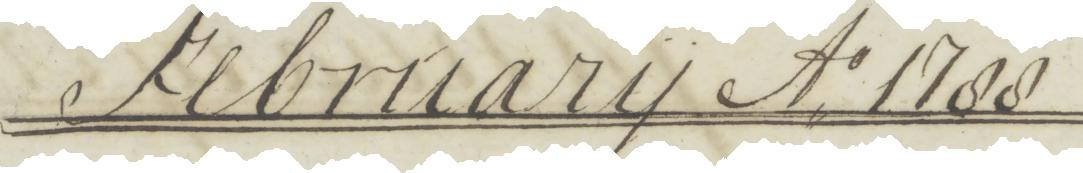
Februarij A„o 1788
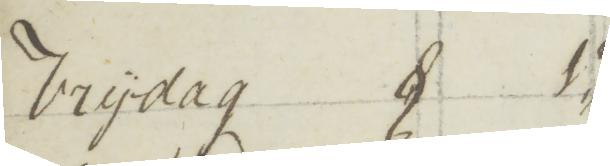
Vrijdag 8 1„e
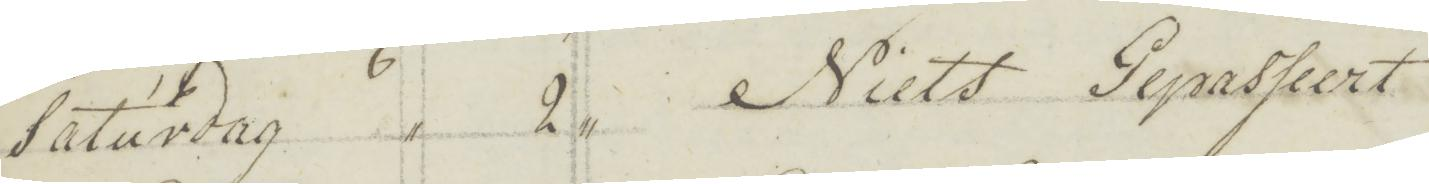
Saturdag „ 2„ Niets Gepasseert
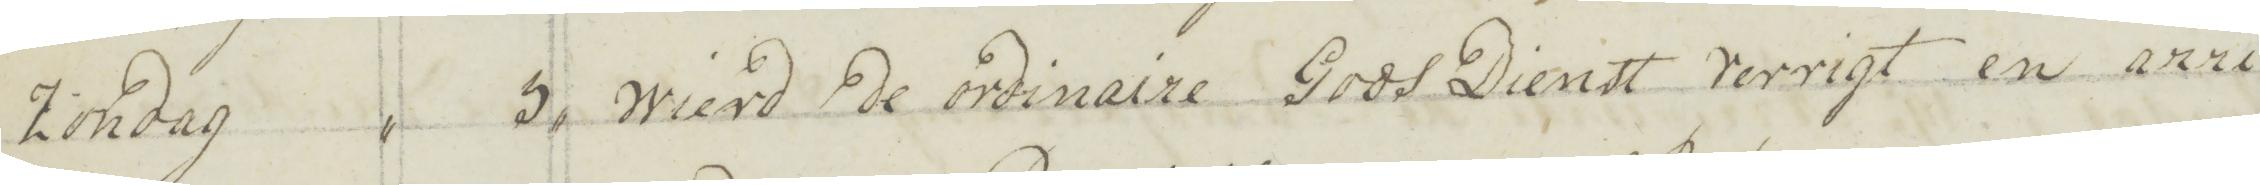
Zondag „ 3„ wierd de ordinaire Gods Dienst verrigt en arri
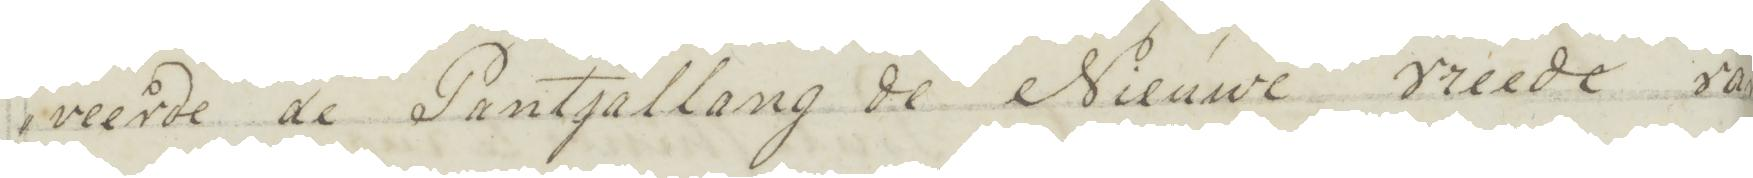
„veerde de Pantjallang de Nieuwe vreede va
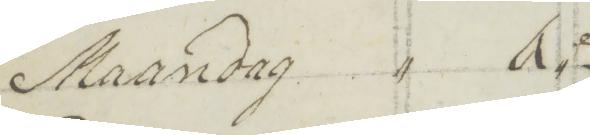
Maandag „ 4„e}
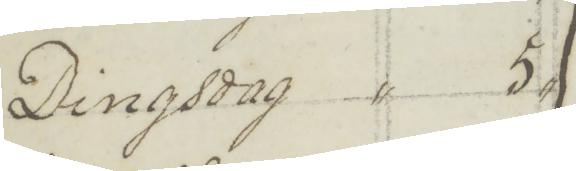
Dingsdag „ 5„}
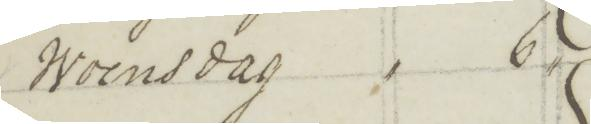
Woensdag „ 6„}
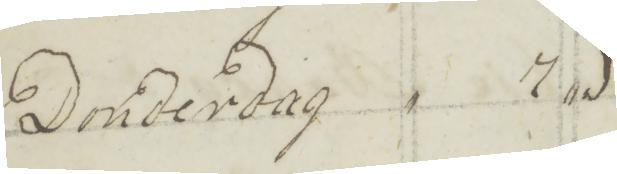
Donderdag „ 7„}
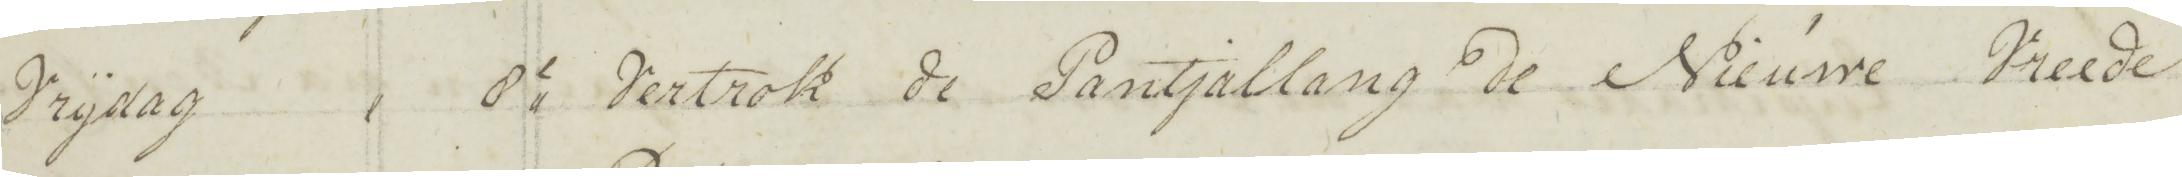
Vrijdag „ 8„e vertrok de Pantjallang de Nieuwe Vreede na
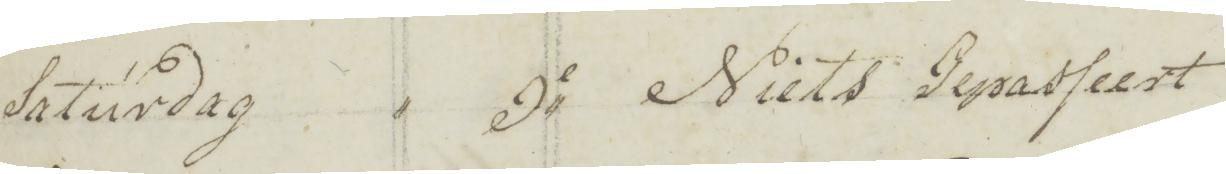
Saturdag „ 9„e Niets Gepasseert
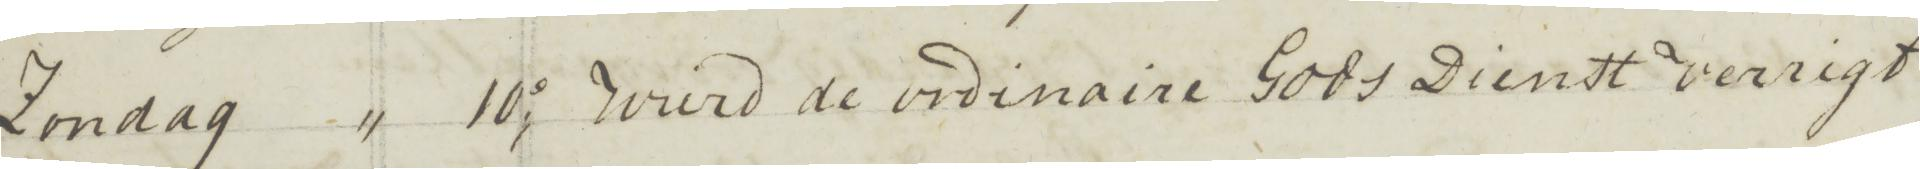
Zondag „ 10„e wierd de ordinaire Gods Dienst verrigt
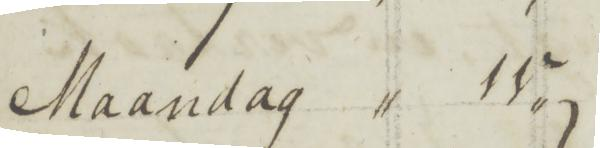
Maandag „ 15„ }
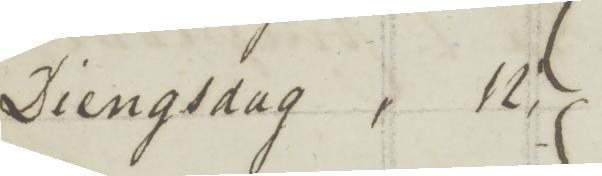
Diengsdag „ 12„ Niets Gepasseert }
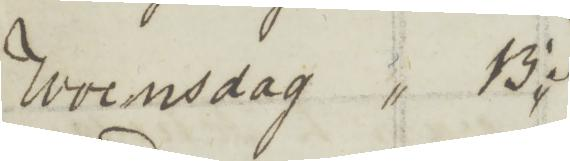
Woensdag „ 13„ }
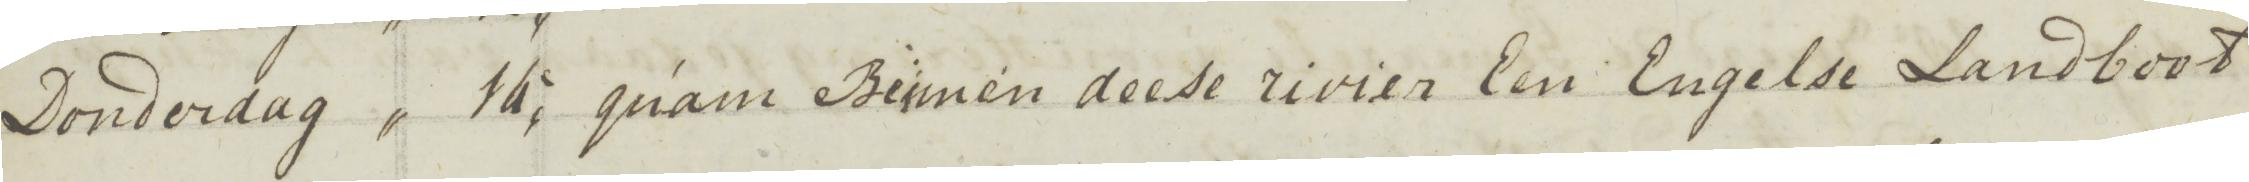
Donderdag „ 14„e quam Binnen deese rivier Een Engelse Landboot
